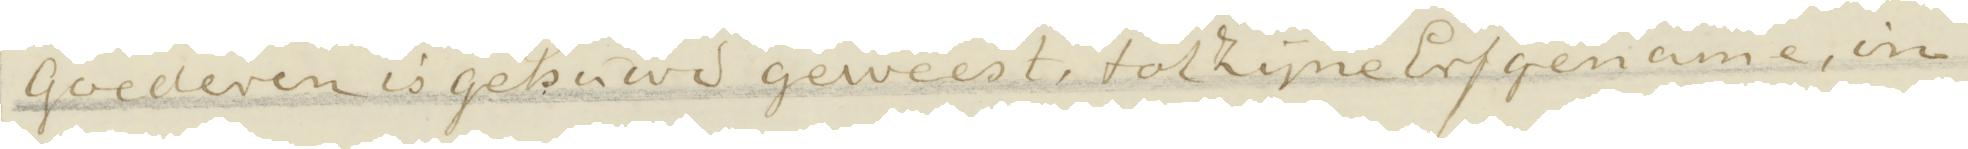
Goederen is gehuwd geweest, tot Zijne Erfgename in
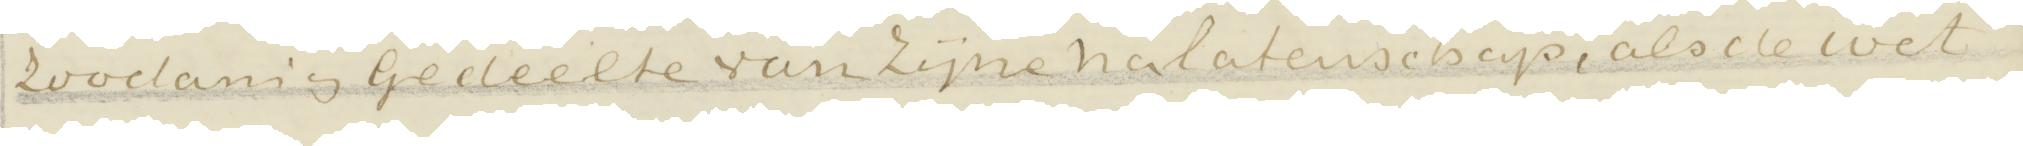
zoodanig gedeelte van Zijne nalatenschap als de wet
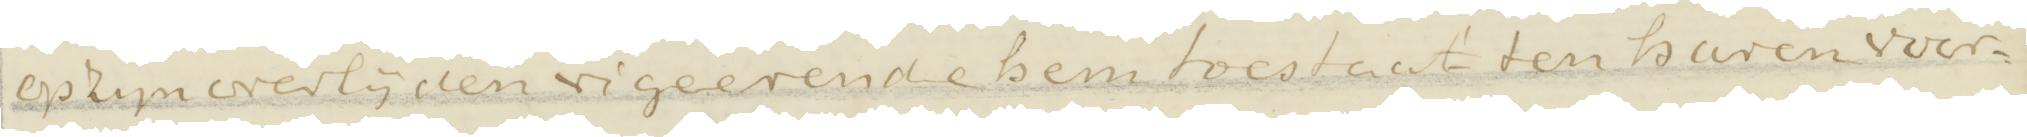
op zyn overlijden vigeerende hem toestaat ten haren voor=
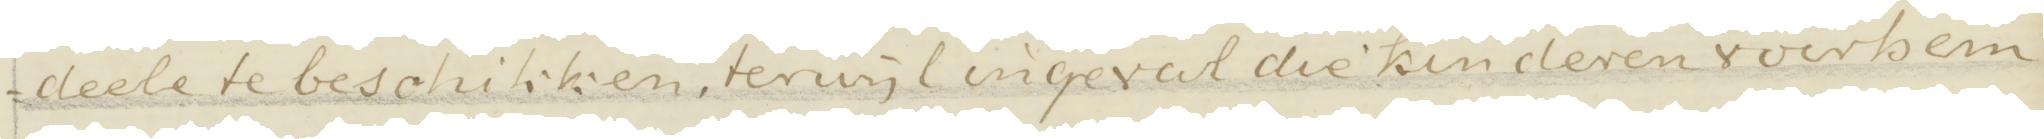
„deele te beschikken terwijl ingeval die kinderen voor hem
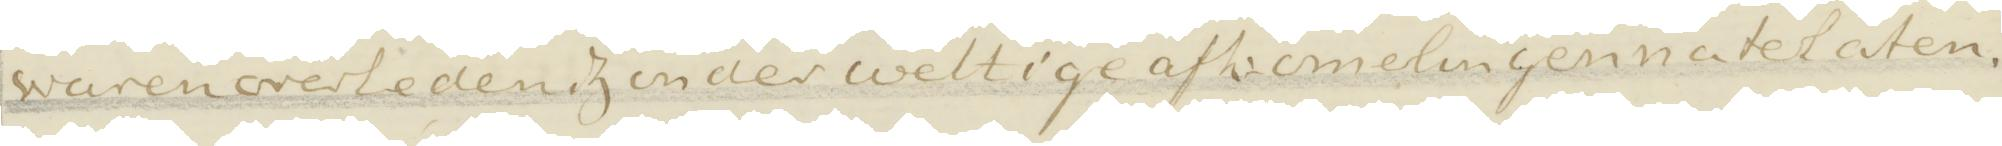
waren overleden Zonder wettige afkomelingen na te laten
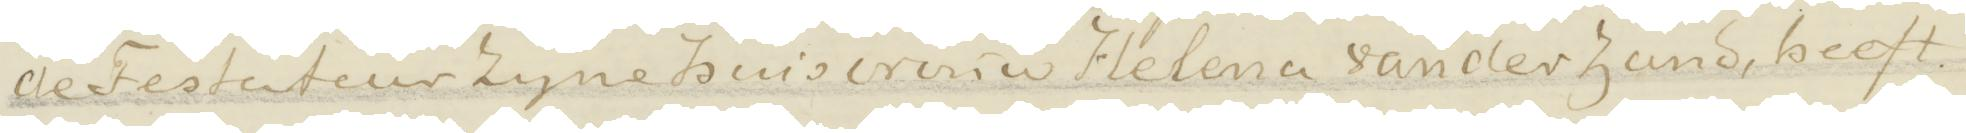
de Testateur Zyne huisvrouw Helena van der Zand, heeft
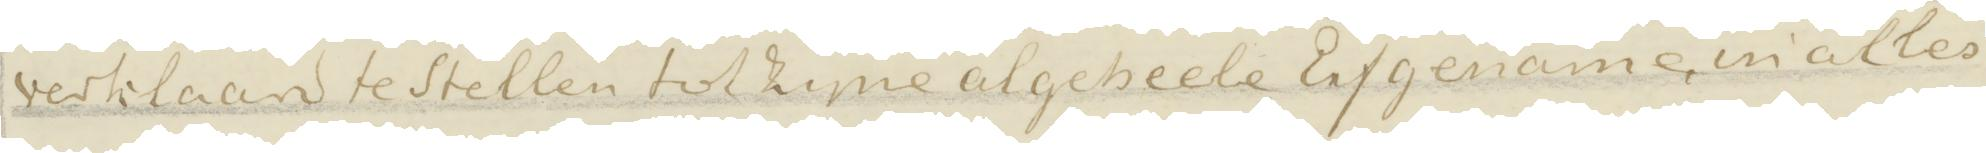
verklaard te stellen tot Zyne algeheele Erfgename in alles
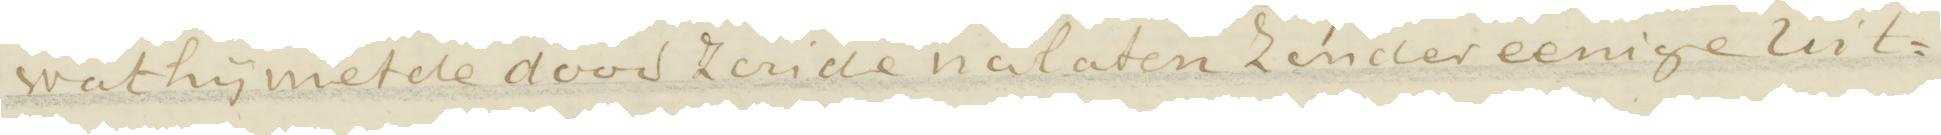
wat hij met de dood Zoude nalaten Zonder eenige uit=
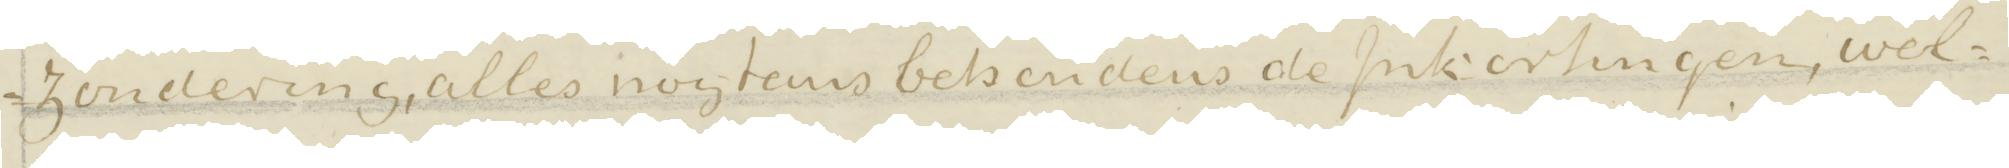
=zondering, alles nogtans behoudens de Jnkortingen, wel=
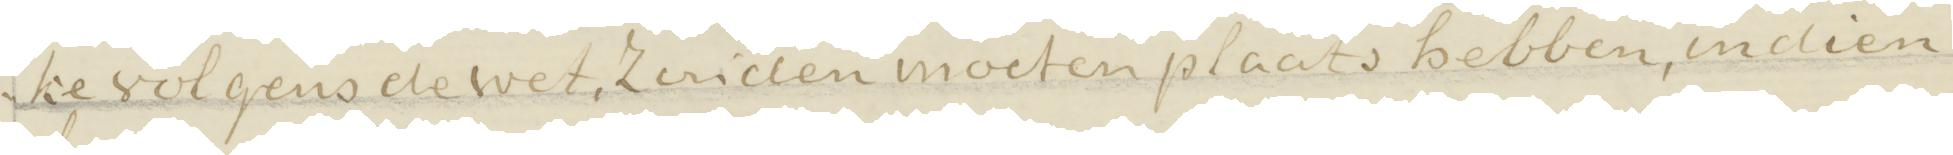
„ke volgens de wet, zonden moeten plaats hebben, indien
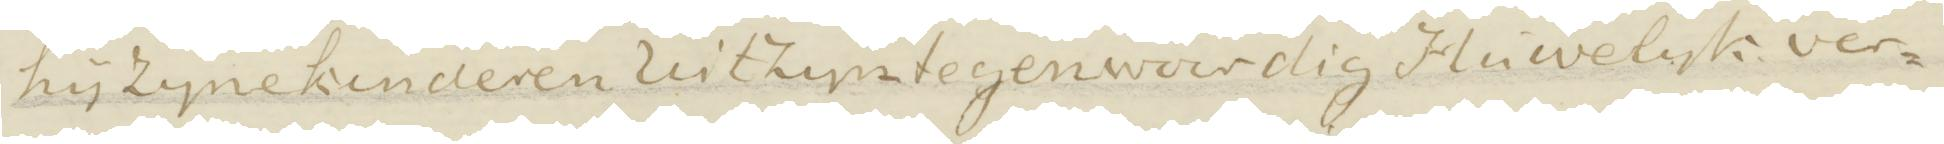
hij Zyne kinderen uit zyn tegenwoordig Huwelyk ver=
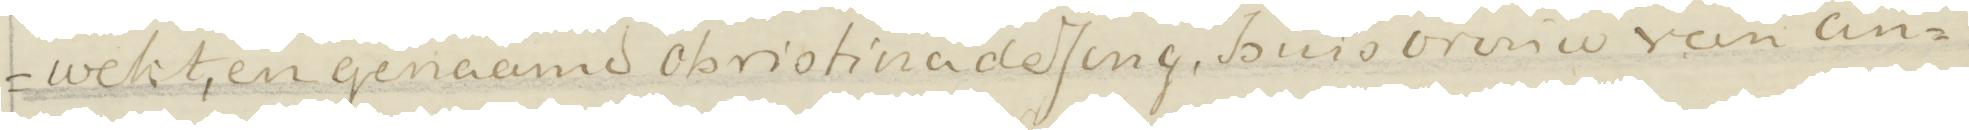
=wekt, en genaamd christina de Jong, huisvrouw van an=
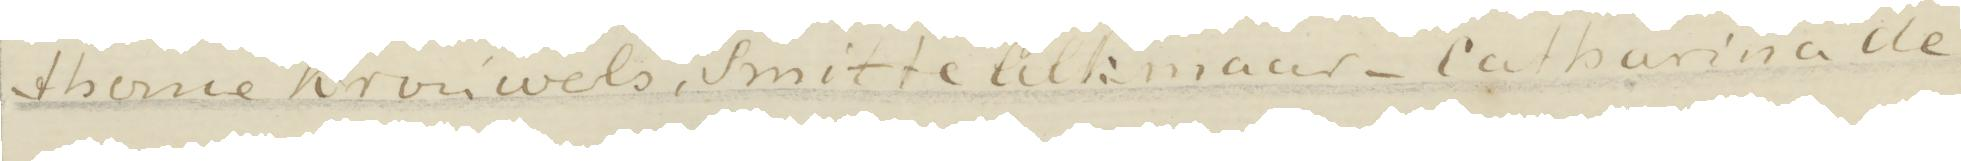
-thonie Krouwels, Smit te Alkmaar - Catharina de
